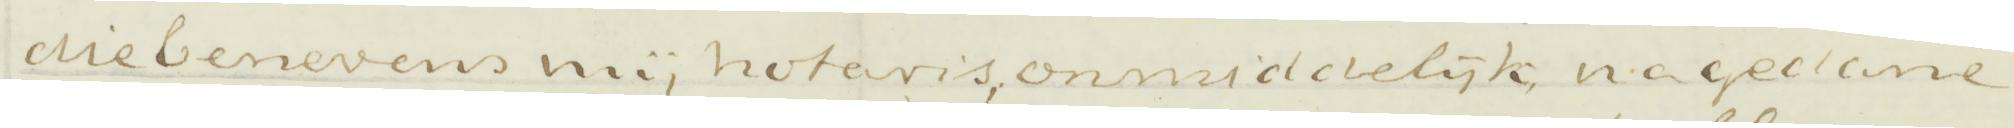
die benevens mij notaris, onmiddelijk nagedane
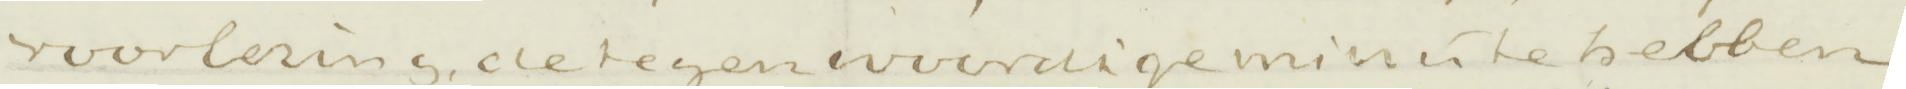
voorlezing, de tegenwoordige minute hebben
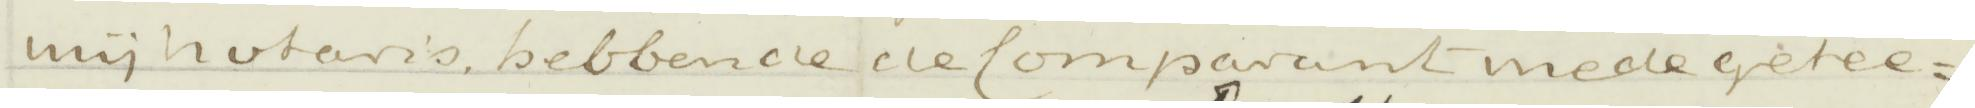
mij notaris, hebbende de Comparant mede getee=
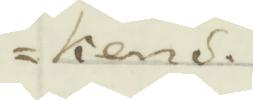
=kend.
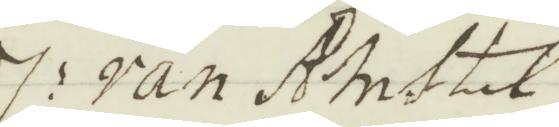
J: van Amstel
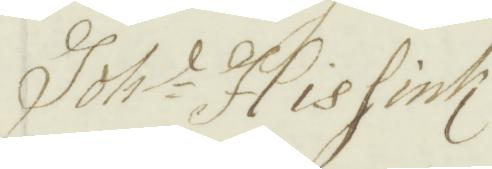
Joh=s Hissink
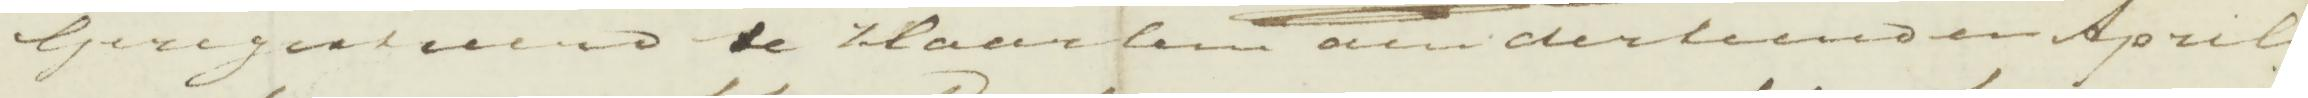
Geregistreerd te Haarlem den dertienden April
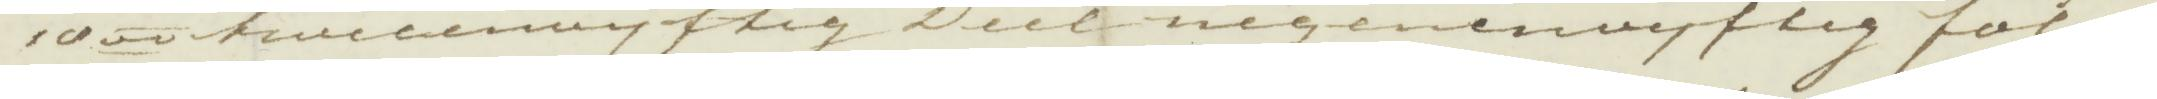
1800 tweeenvyftig Deel negenenvyftig folio
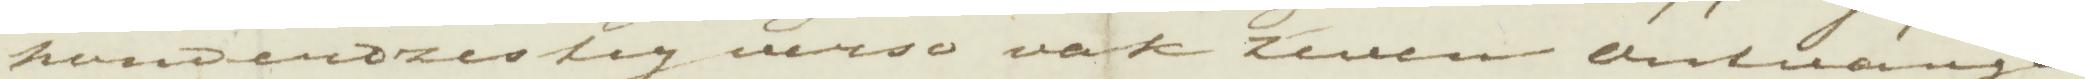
honderdzestig verso vak zeven ontvangen
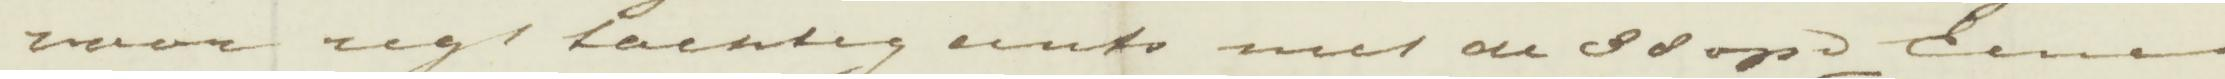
voor regt tachtig cents met de 38 opc Eene
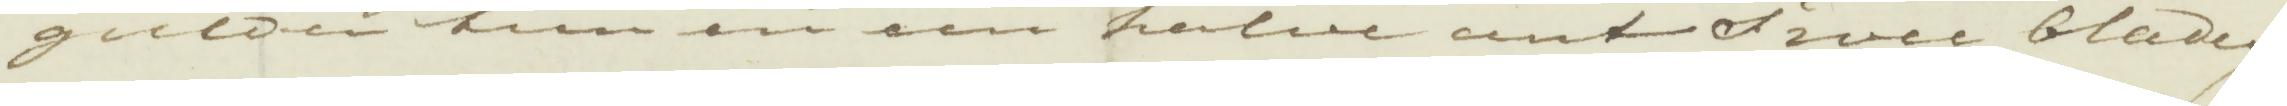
gulden tien en een halve cent Twee bladen
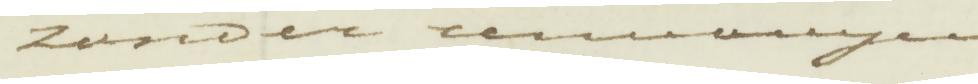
zonder renvooyen
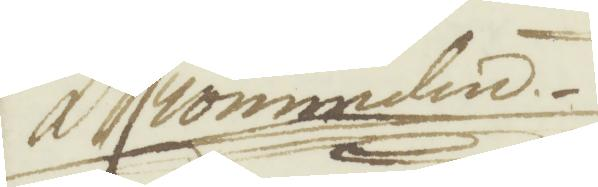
DF Crommelin.-
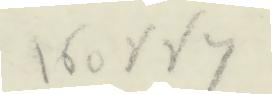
160vv7
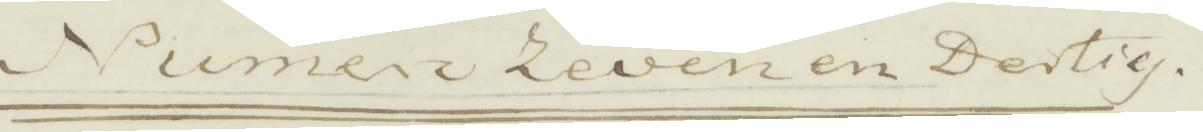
Numero Zeven en Dertig.
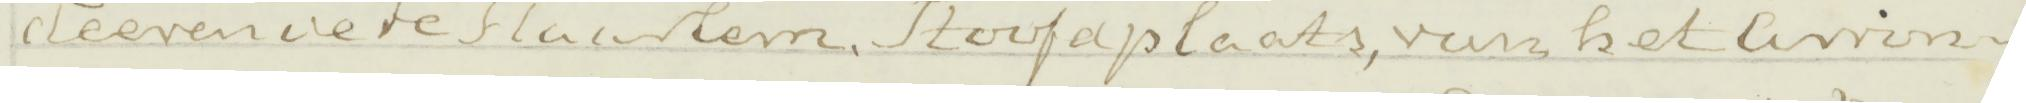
deerende te Haarlem, Hoofdplaats, van het Arron=
